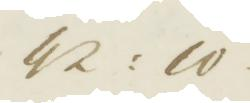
42: 10 —
